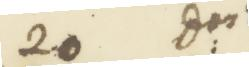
20 d:os
